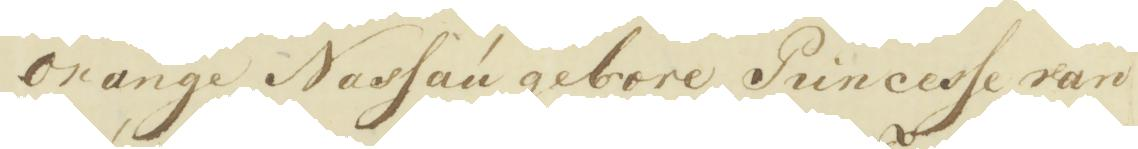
orange Nassau gebore Princesse van
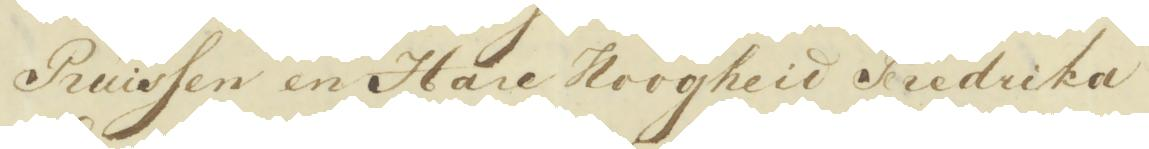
Pruissen en Hare Hoogheid Fredrika
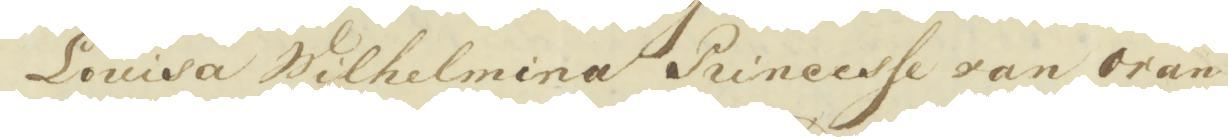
Louisa Wilhelmina Princesse van Oran
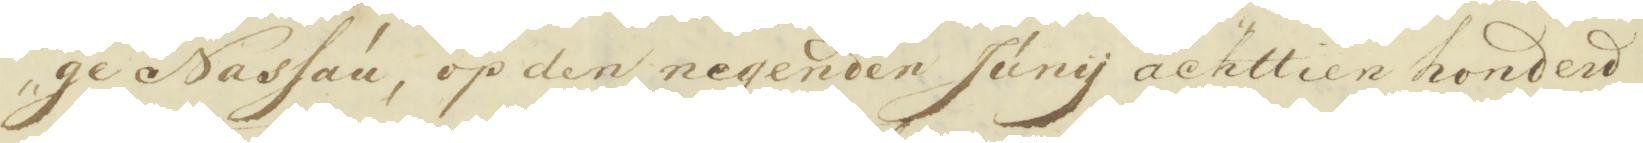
„ge Nassau, op den negenden Junij achttien honderd
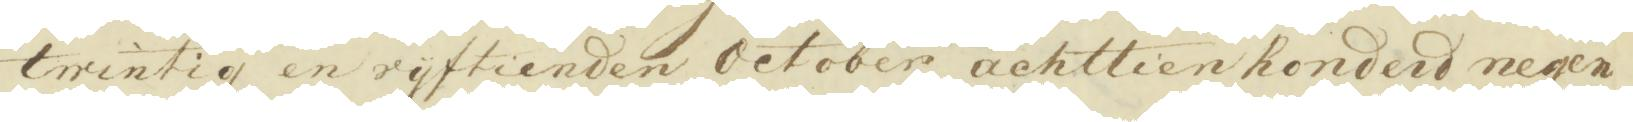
twintig en vijftienden October achttien honderd negen
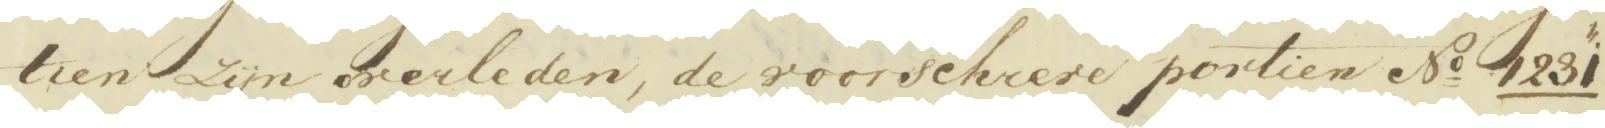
tien zijn overleden, de voorschreve portien N=o 1231
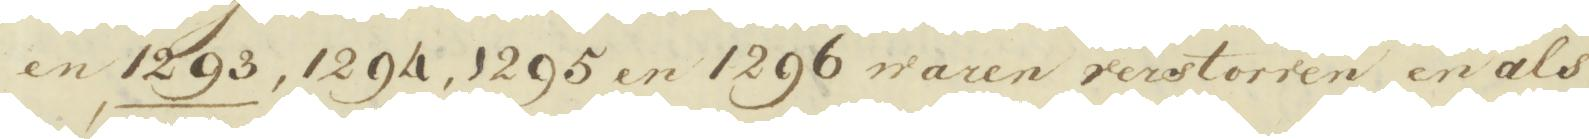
en 1293, 1294, 1295 en 1296 waren verstorven en als
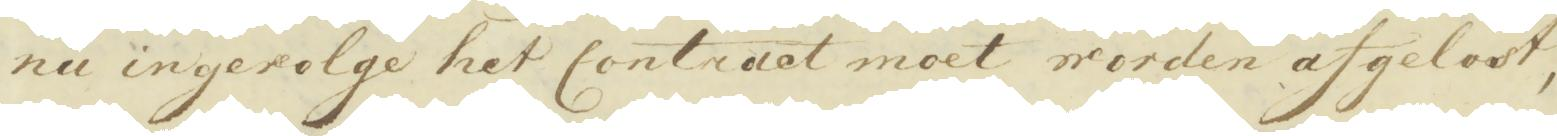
nu ingevolge het contract moet worden afgelost
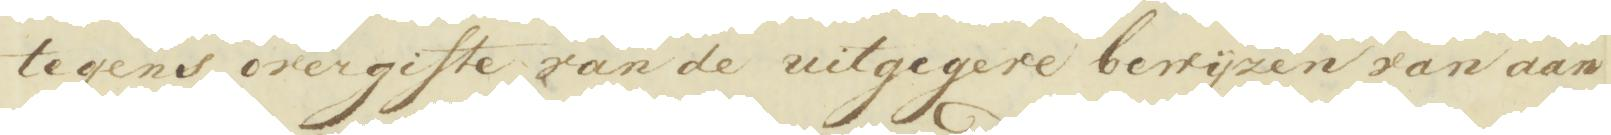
tegens overgifte van de uitgegeve bewijzen van aan
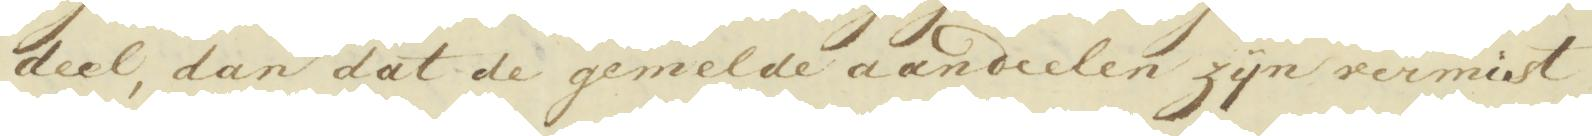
deel, dan dat de gemelde aandeelen zijn vermist
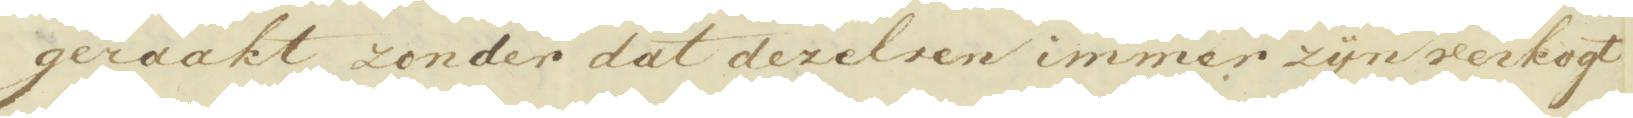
geraakt, zonder dat dezelven immer zijn verkogt
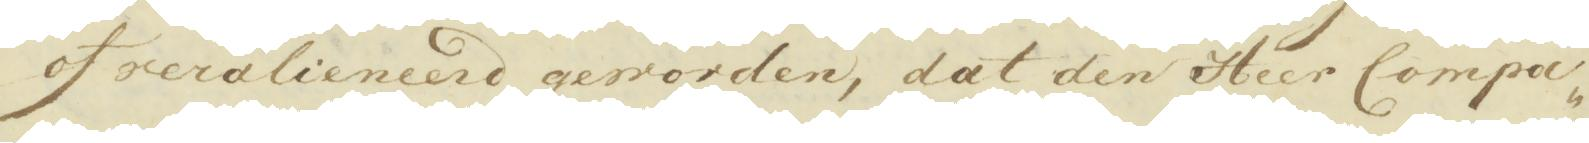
of veralieneerd geworden, dat den Heer Compa„
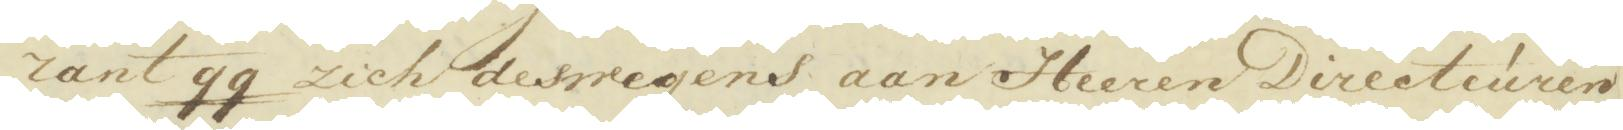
rant qq zich deswegens aan Heeren Directeuren
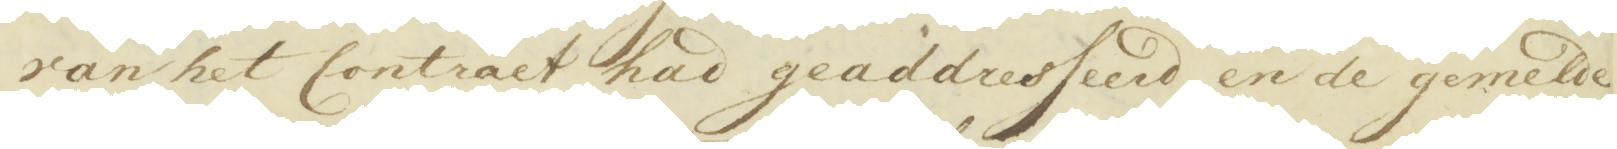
van het contract had geaddresseerd, en de gemelde
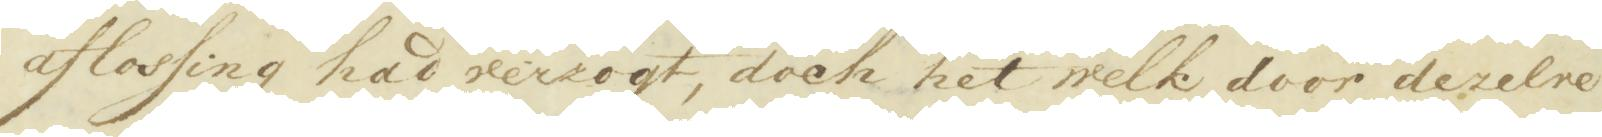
aflossing had verzogt, doch het welk door dezelve
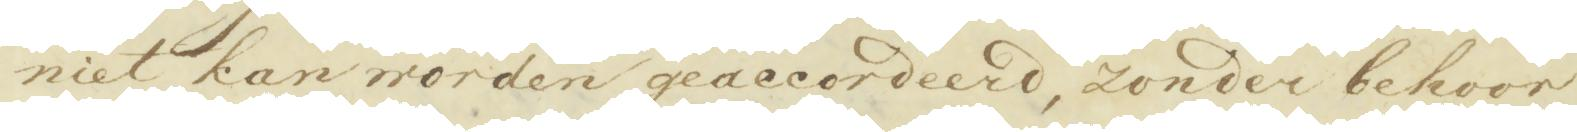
niet kan worden geaccordeerd, zonder behoor
